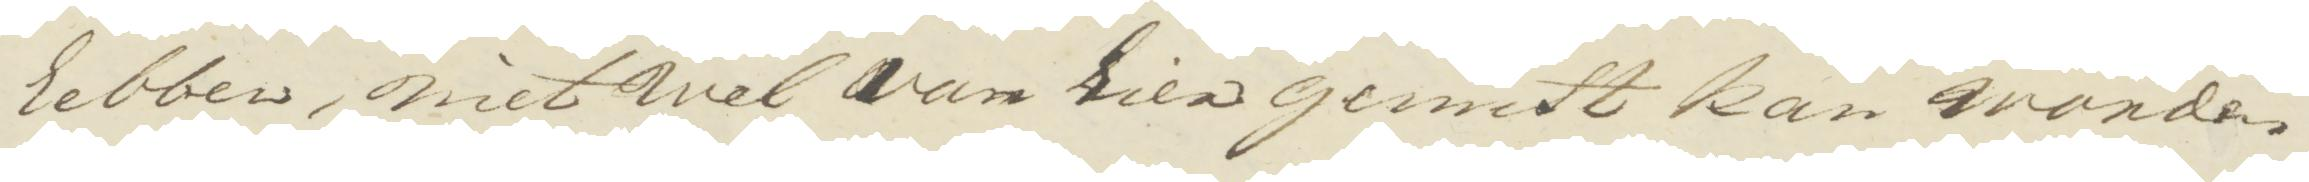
hebben, niet wel van hier gemist kan worden
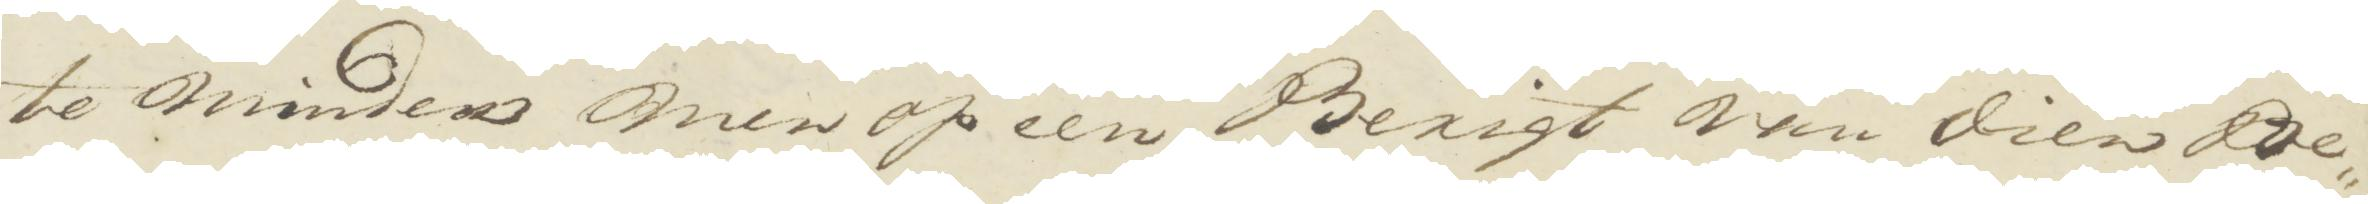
te minders men op een Berigt van dien Be„
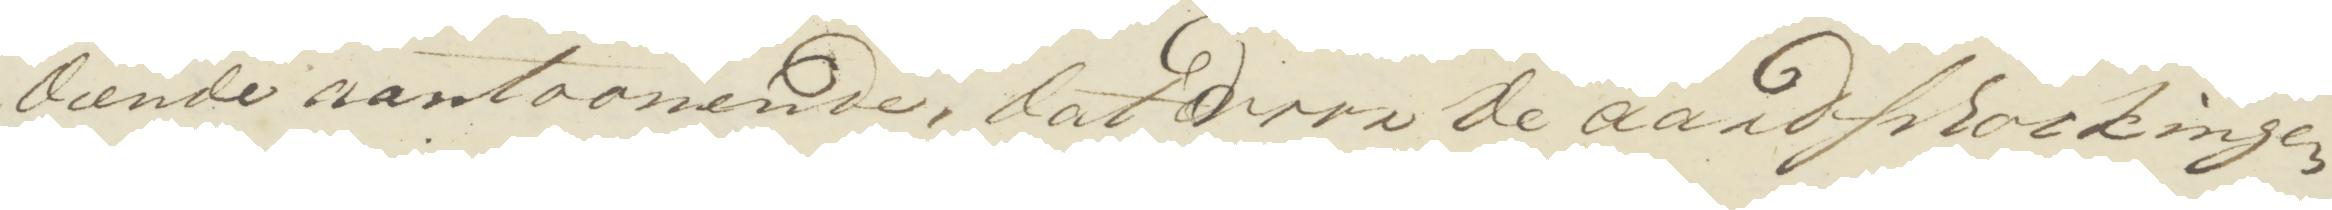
diende aantoonende, dat door de aardschockingen
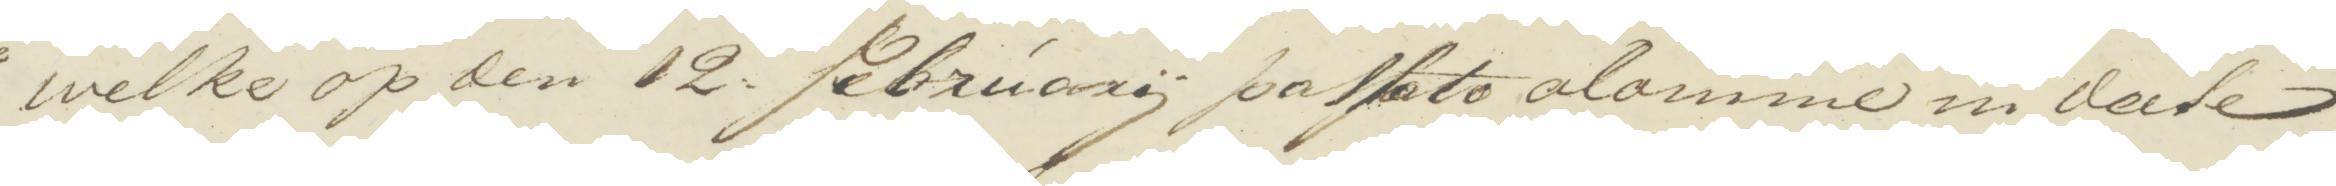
welke op den 12. februarij passato alomme in deese
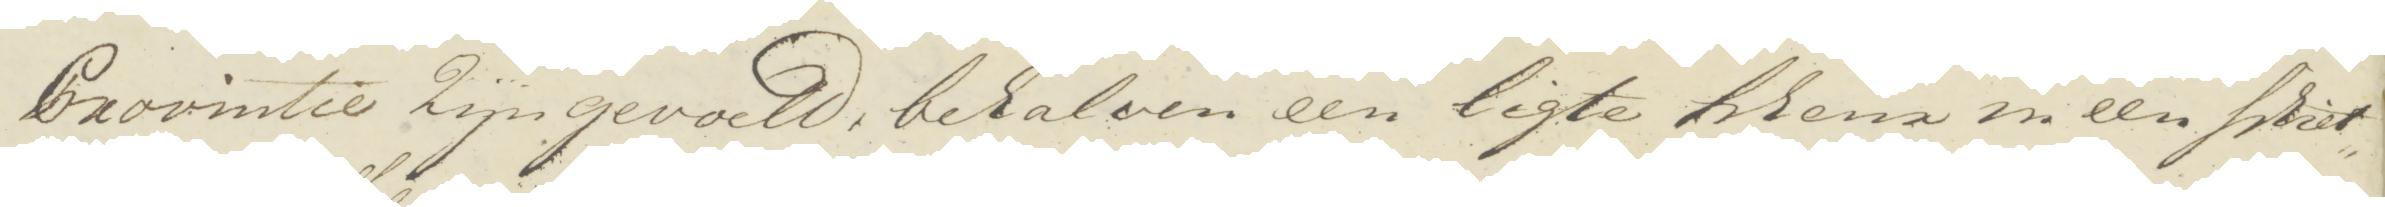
Provintie Zijn gevoeld, behalven een ligte Scheur in een Schiet„
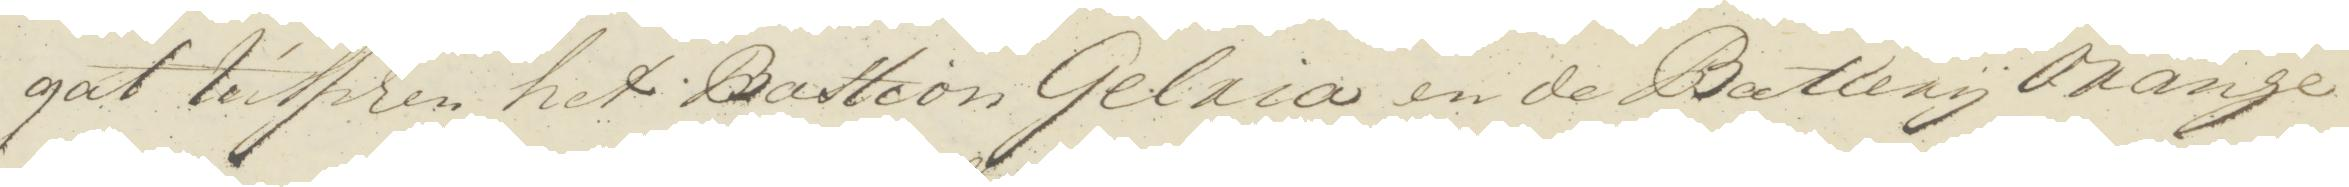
gat tusschen het Bastion Gelria en de Batterij Orange
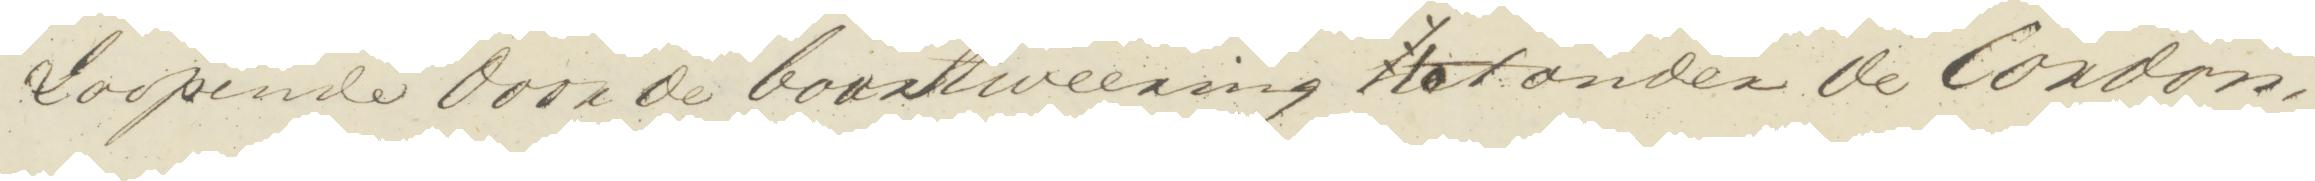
Loopende door de borztweering /tot onder de Cordon,
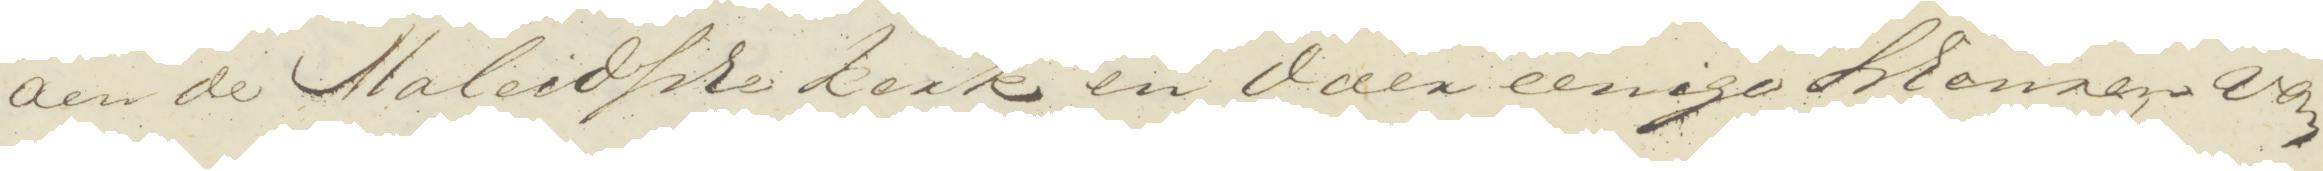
aen de Maleidsche kerk en daer eenige Scheuren van
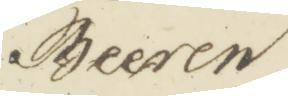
Beeren
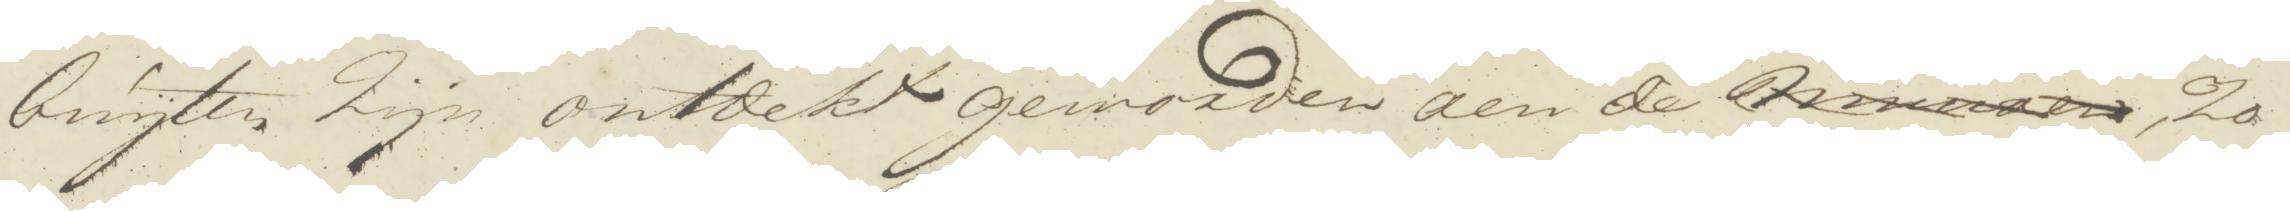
buijten Zijn ontdekt geworden aen de Muuren, Zo
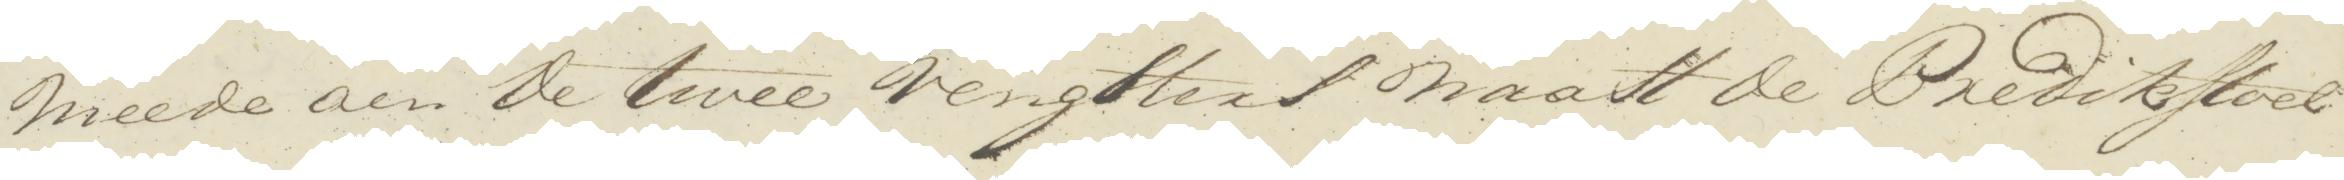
meede aen de twee vengsters naast de Predikstoel
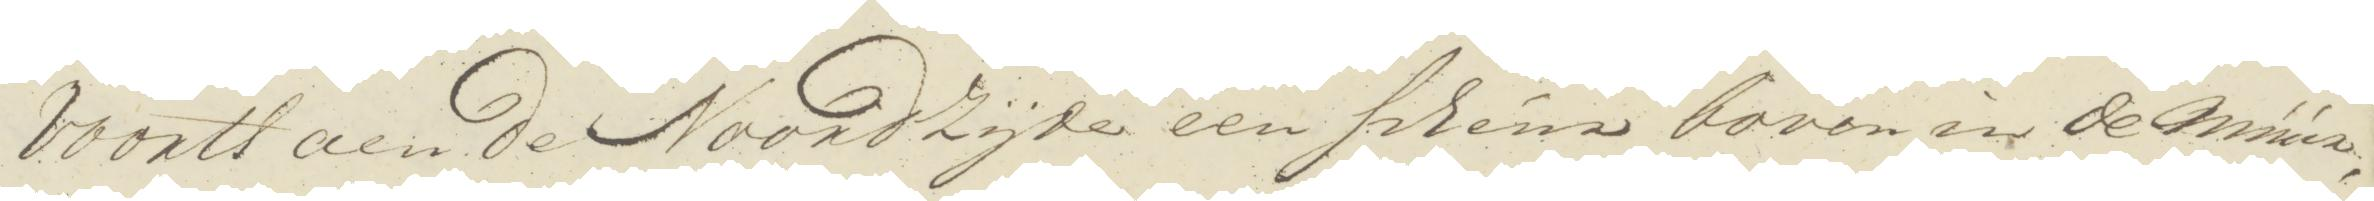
Voorts aen de Noordzijde een scheur boven in de muur,
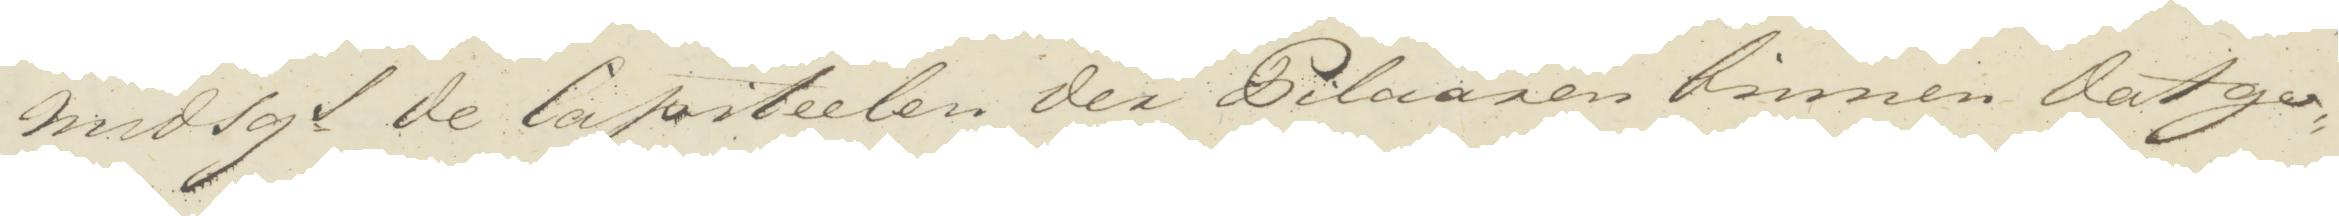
midsg:s de Capiteelen der Pilaaren binnen dat ge„
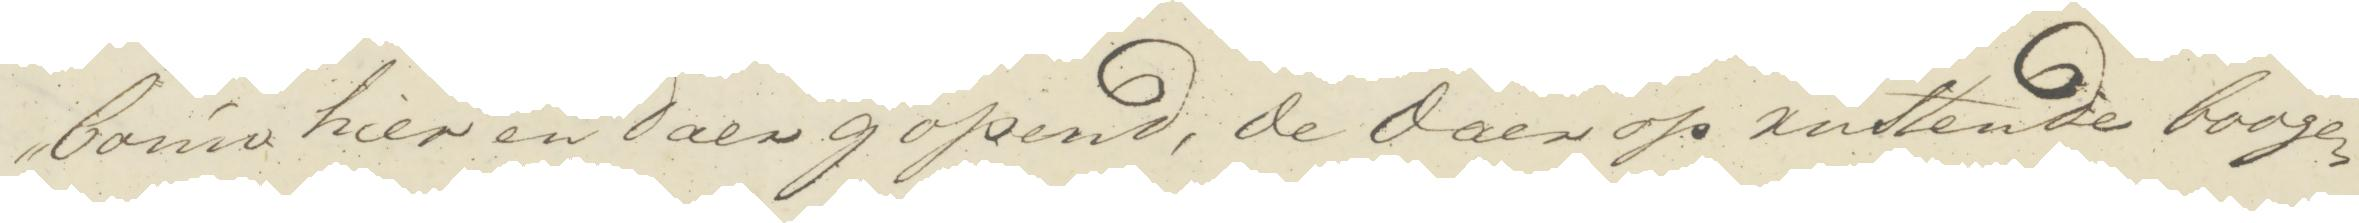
„bouw hier en daer g'opend, de daer op rustende boogen
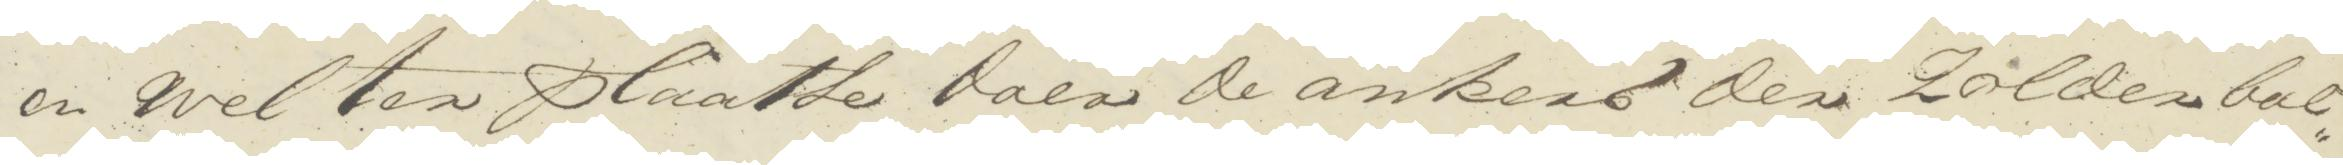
en wel ter plaatse daer de ankers der Zolder bal„
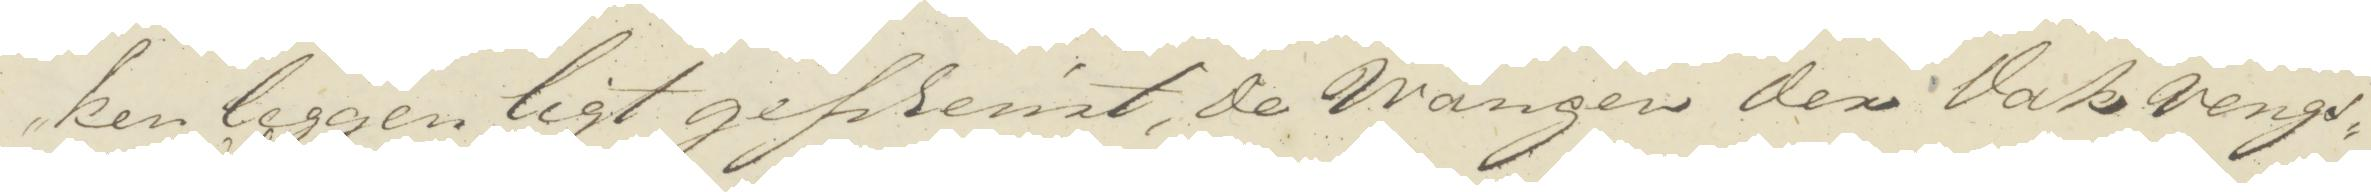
„ken leggen ligt gescheurt, de wangen der Dak vengs„
